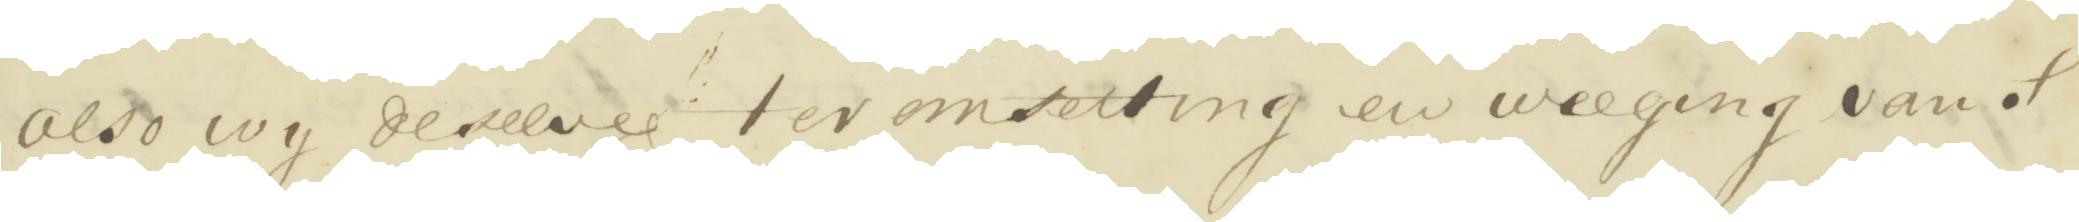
also wy dezelve ter omsetting en weeging van s
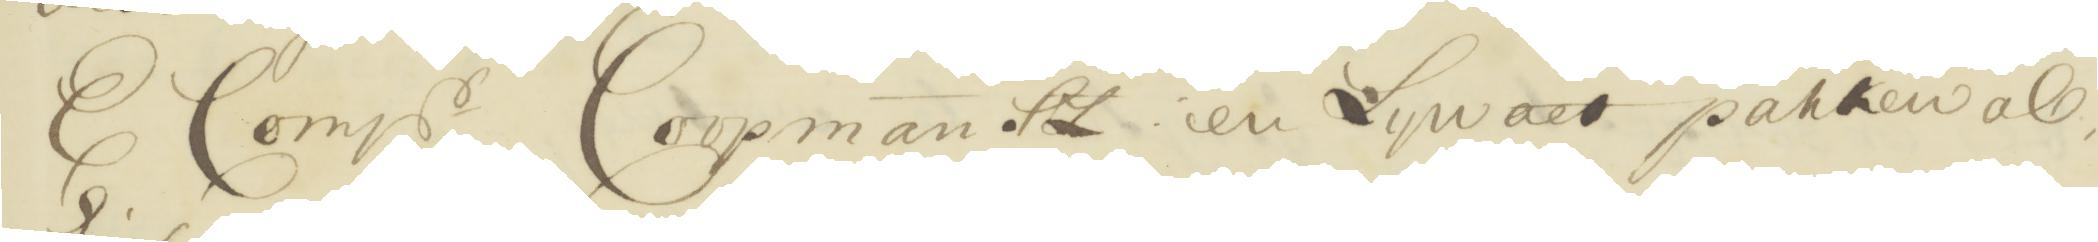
E Comps Coopmansz en Lywaet pakken al
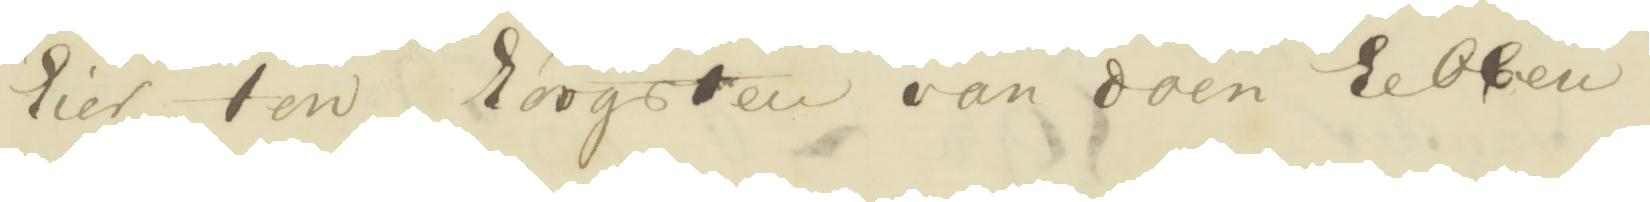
hier ten hoogsten van doen hebben
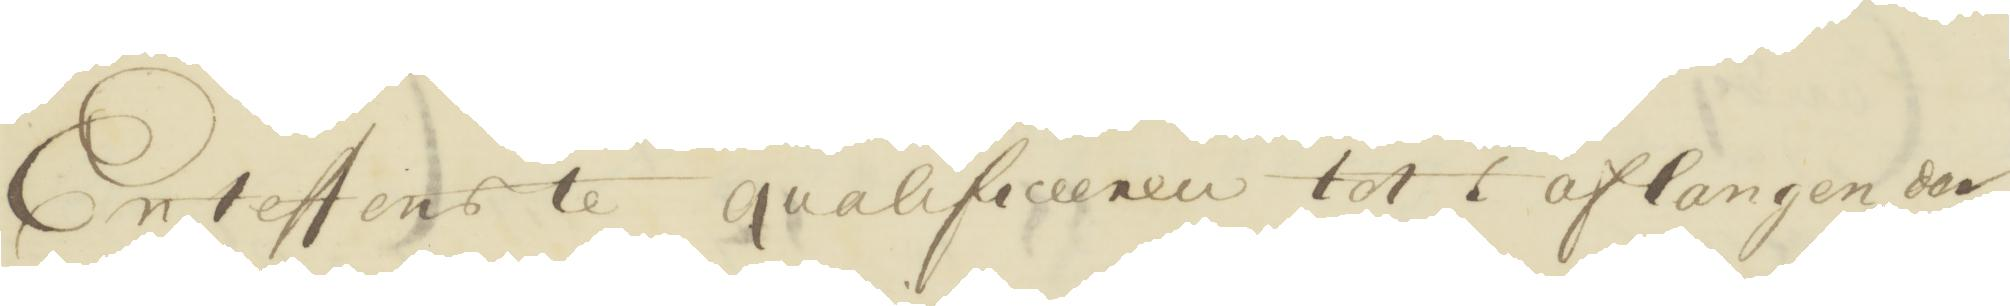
En teffens te qualificeeren tot t aflangen der
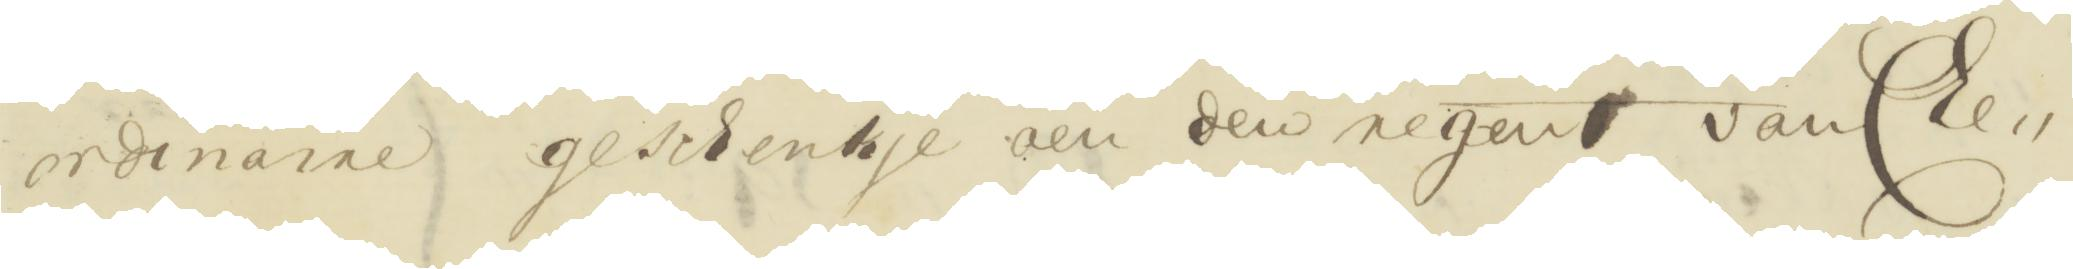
ordinaire geschenkje aen den regent van Che„
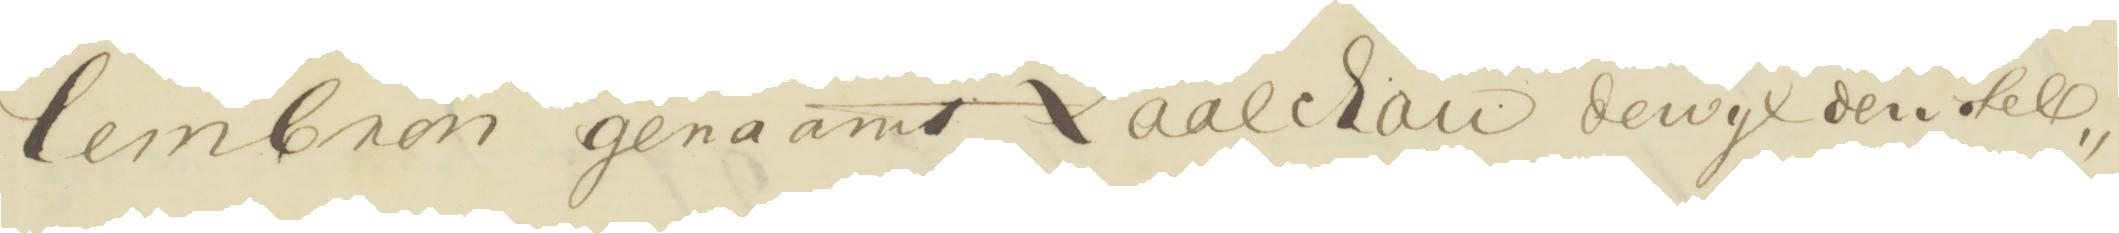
lembron genaamt Laalchan dewyl den sel„
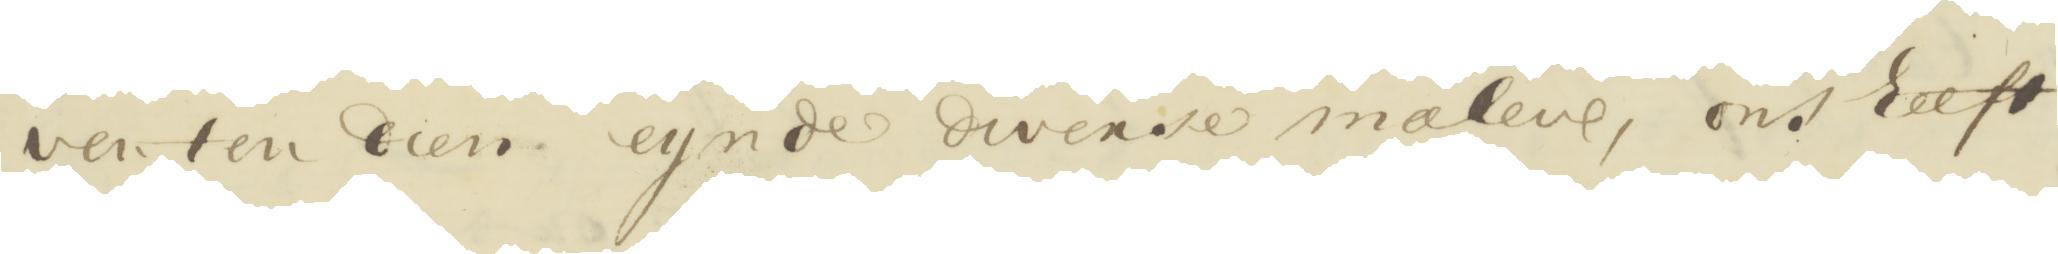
ver ten dien eynde diverse malen, ons heeft
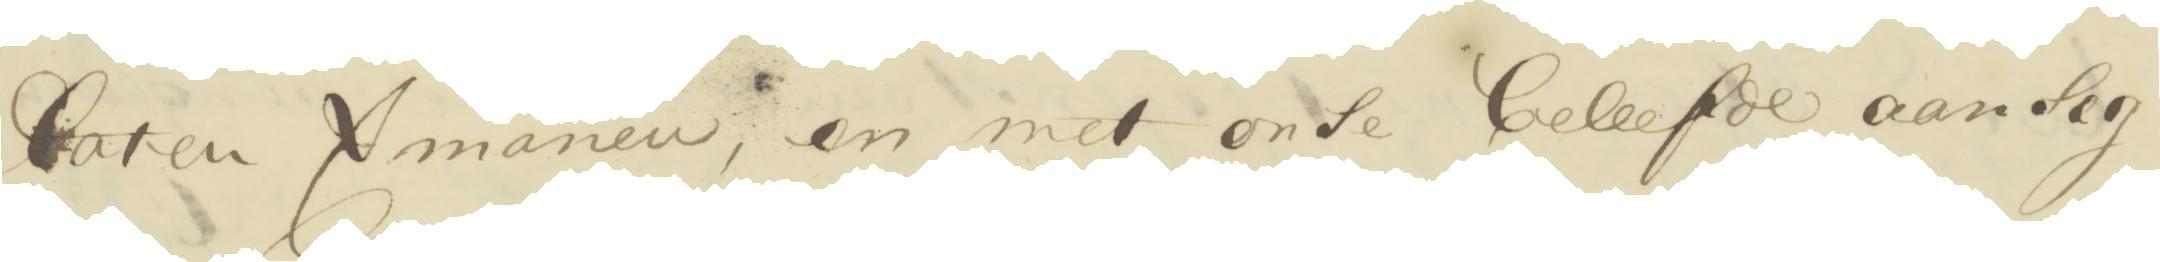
laten vermanen, en met onse beleefde aan seg
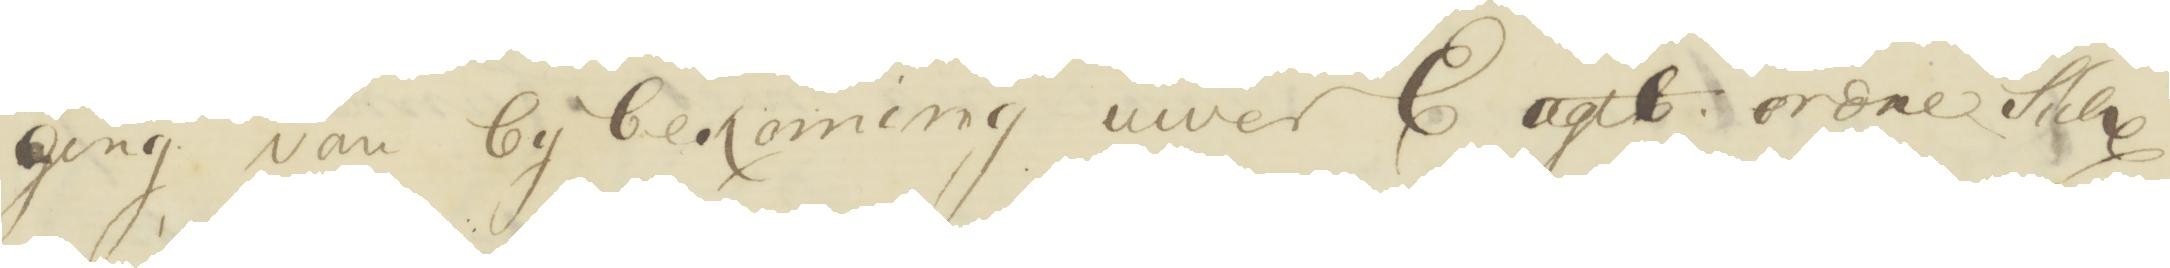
ging van by bekoming uwer E agtb: ordre sulx
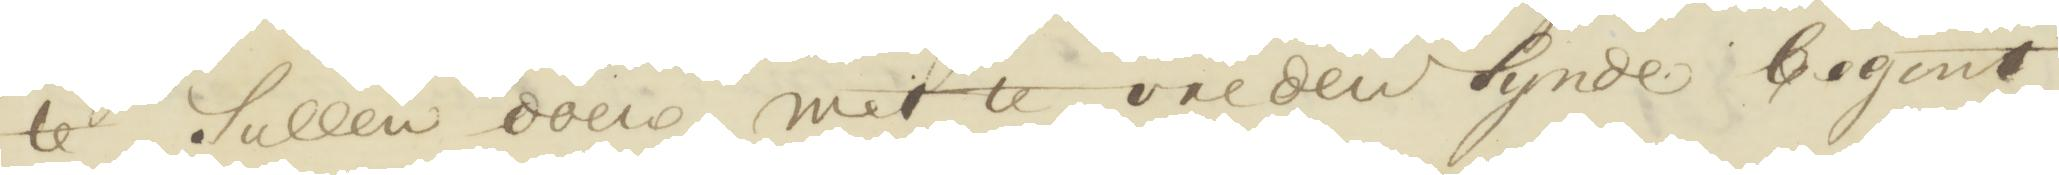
te sullen doen, niet tevreden synde begint
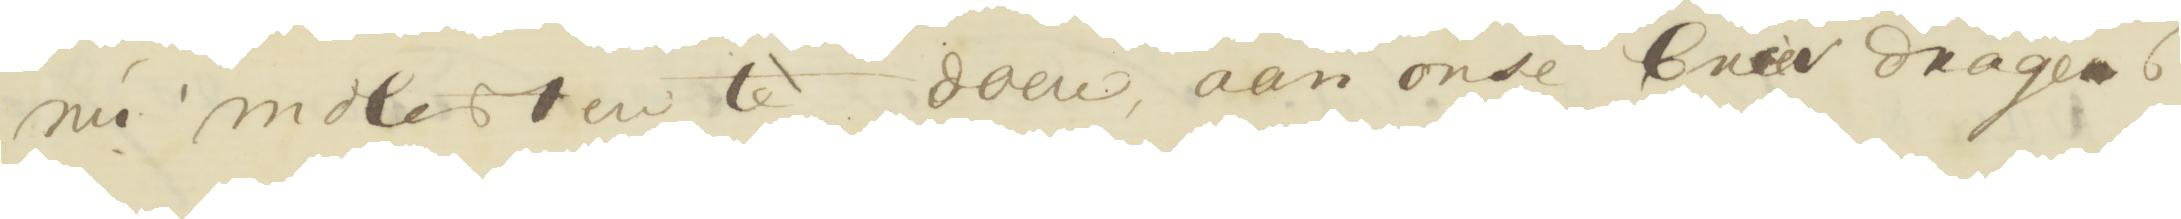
nu molesten te doen, aan onse briev dragers
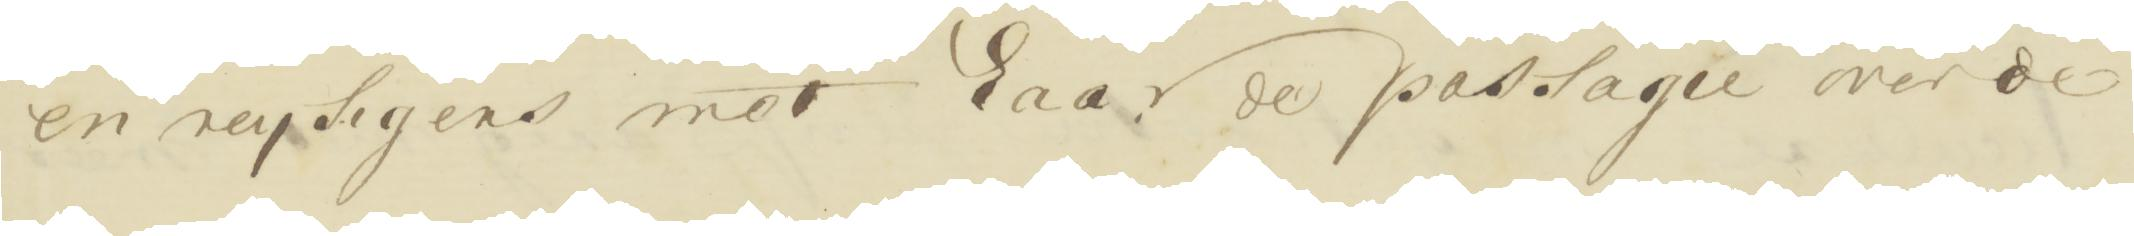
en reysigers met haar de passagie over de
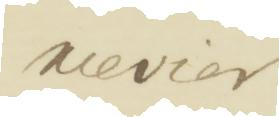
rievier
